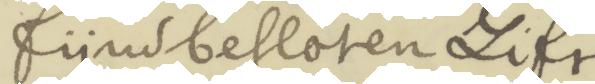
fijne besloten zift
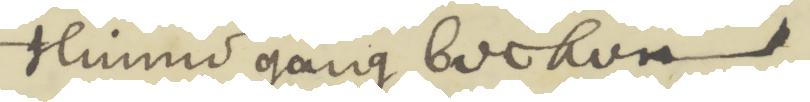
thinne gang becker
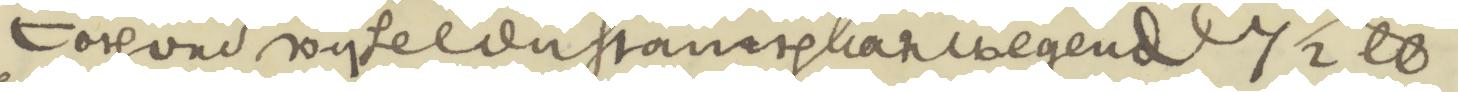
Copere wijselen stampkar wegende 7½ lb.
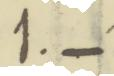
1. –
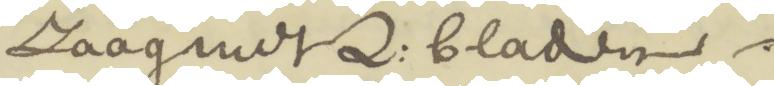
zaag met 2: bladen
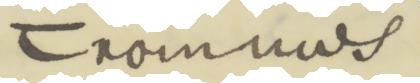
crom mes
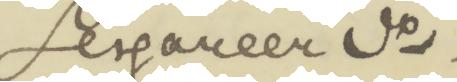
Separeer d_o
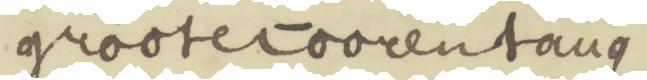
groote coorentang
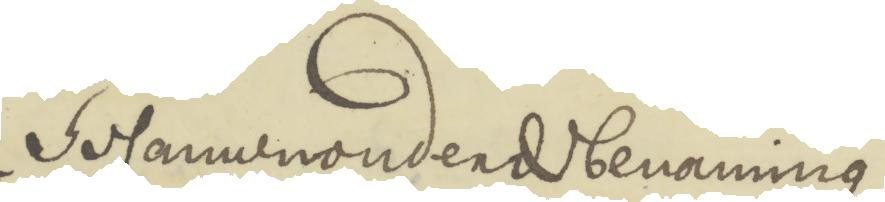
Tesamen onder de benaming
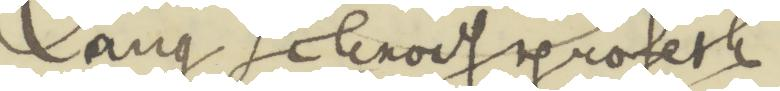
Lang schroef profeth
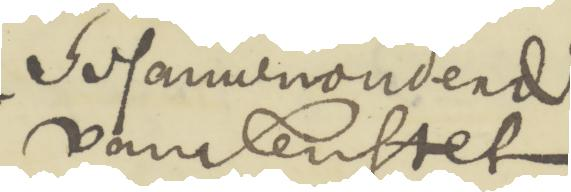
van Herstel
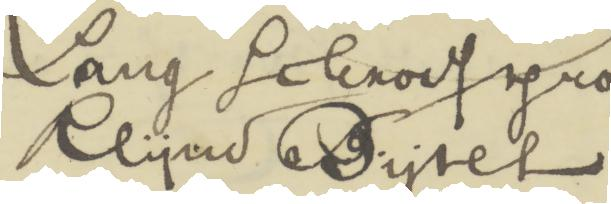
Klijne Bijtel
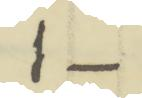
1 –
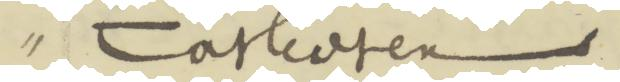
„ Catheter
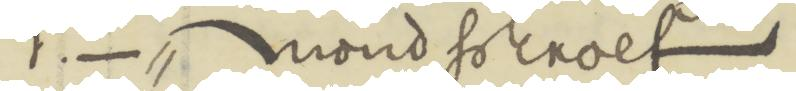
1. – „ mond schroef
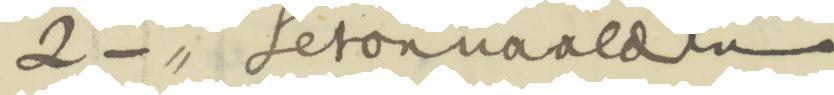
2 – „ setornaalden
